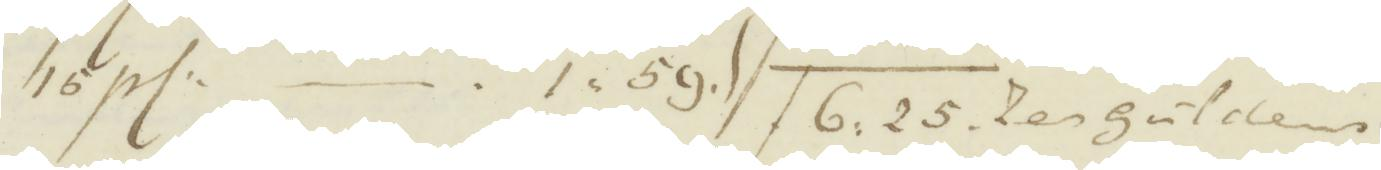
15/c=t 1: 59. ƒ6: 25. zes guldens
